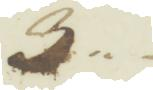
3 „ —
